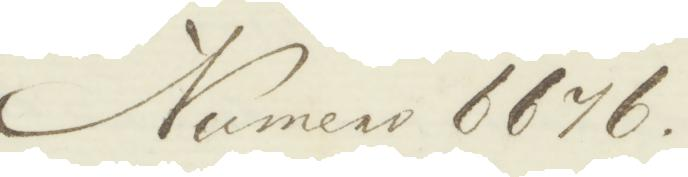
Numero 6676.
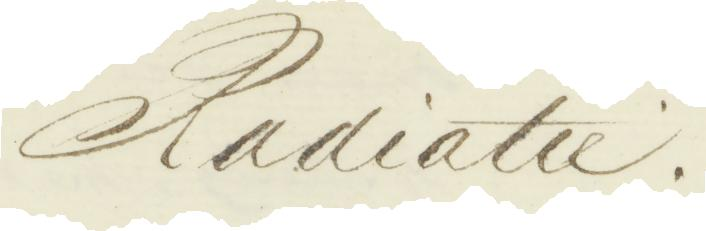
Radiatie:
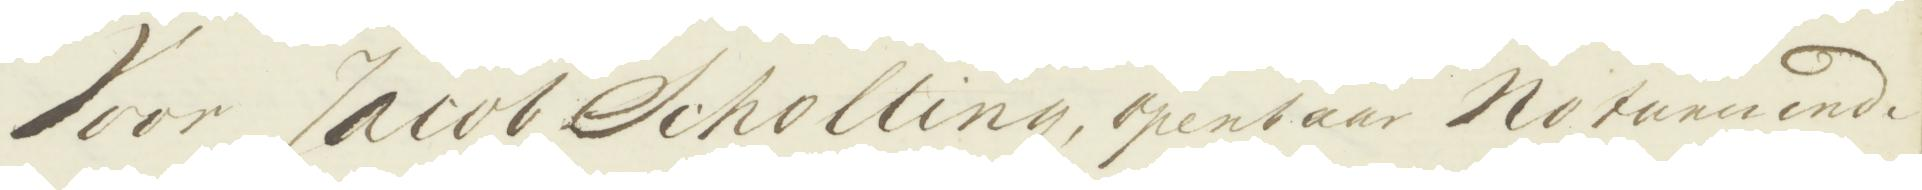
Voor Jacob Scholting, openbaar notaris ende
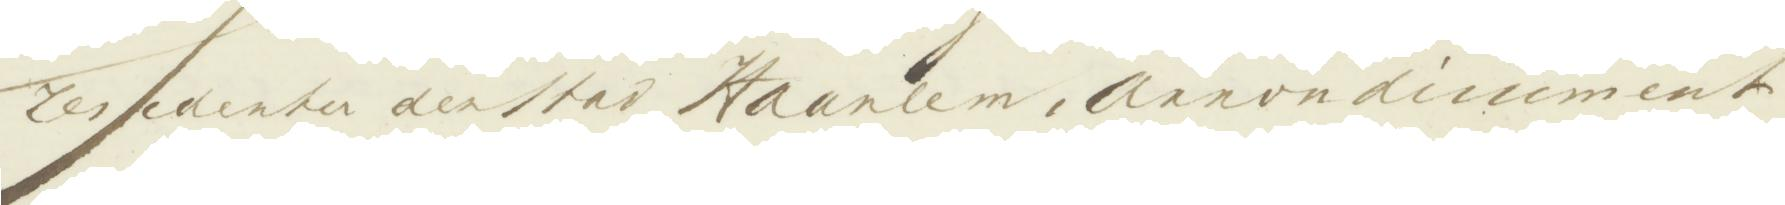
residente der stad Haarlem, arrondissement
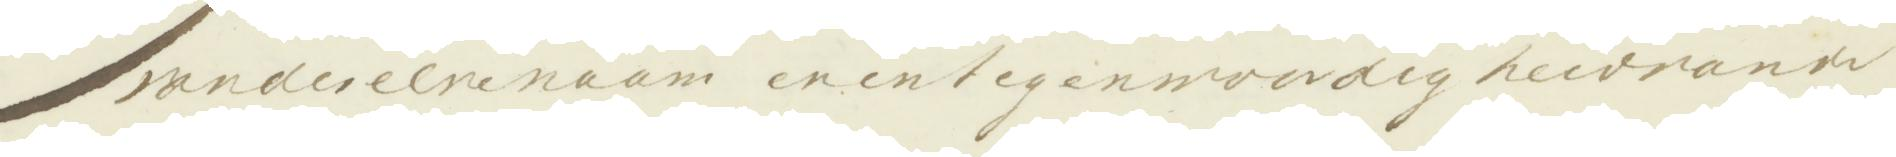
van deselve naam en integenwoordig heid van de
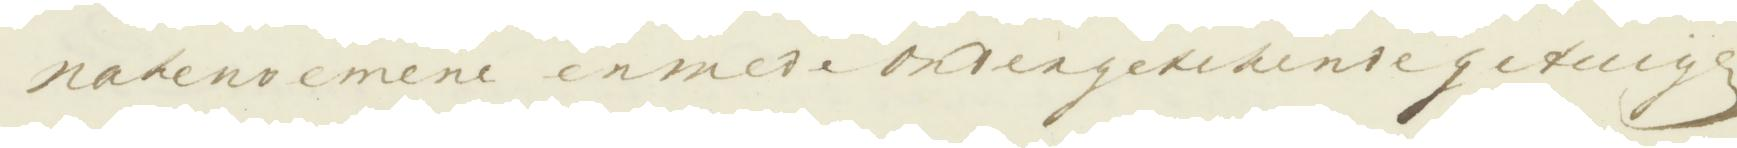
natenoemene en mede ondergetekende getuigen
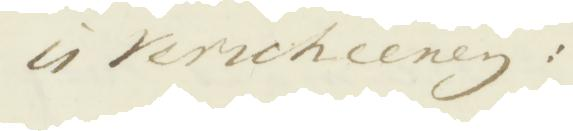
is verscheenen:
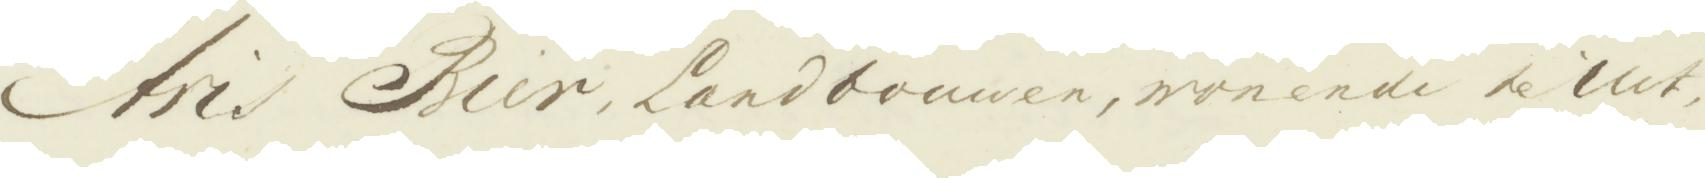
Aris Bier, Landbouwer, wonende te Uit,
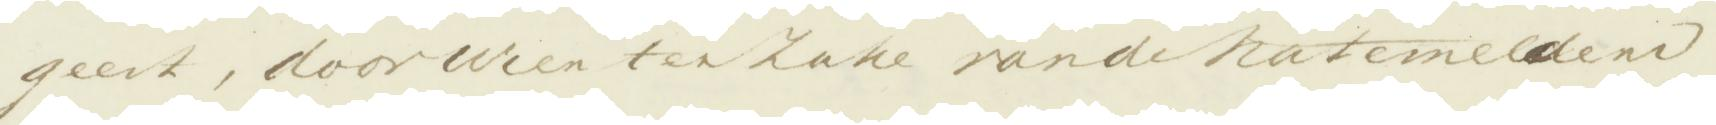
geest, door wien ter zake van de natemelden
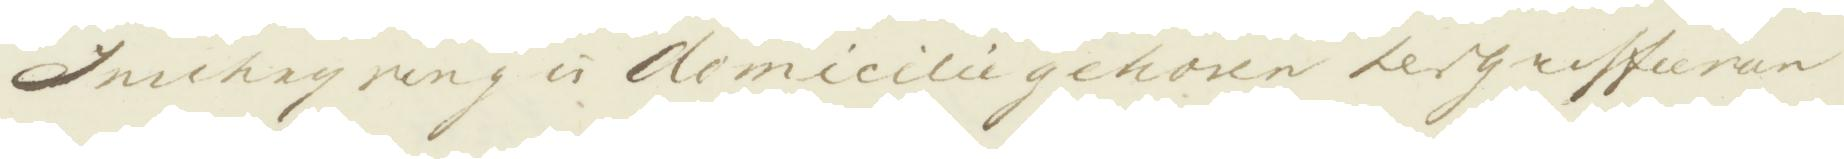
Inschryving is domicilie gekozen ter griffie van
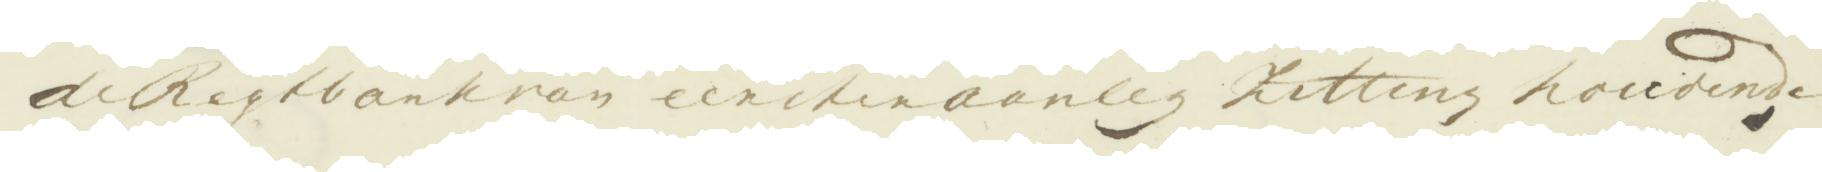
de Regtbank van eersten aanleg zitting houdende
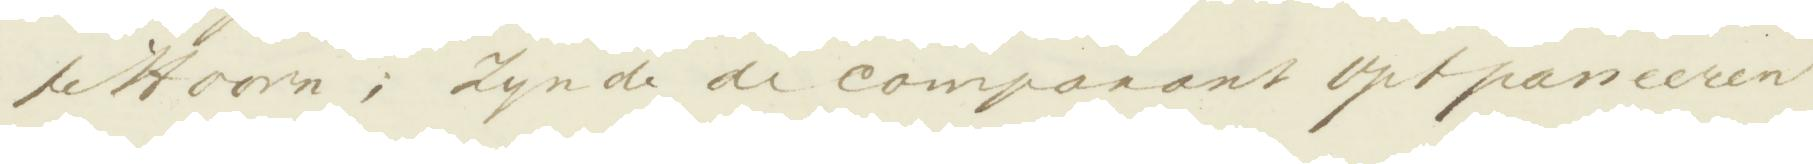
te Hoorn; zynde de comparant opt passeeren
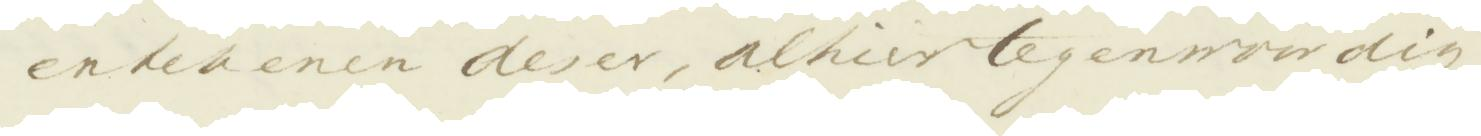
en tekenen deser, alhier tegenwoordig
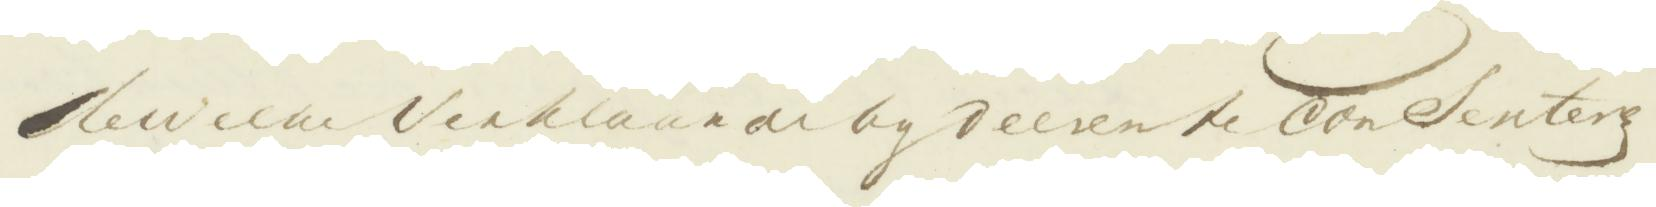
dewelke verklaarde by deesen te consenteren
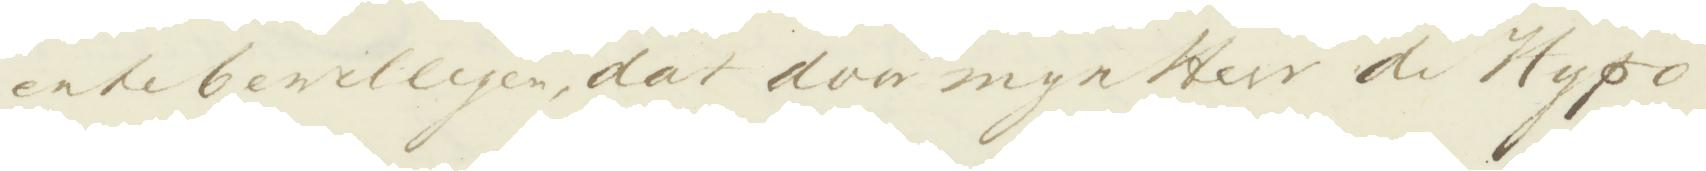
en te bewilligen, dat door myn Heer de Hypo
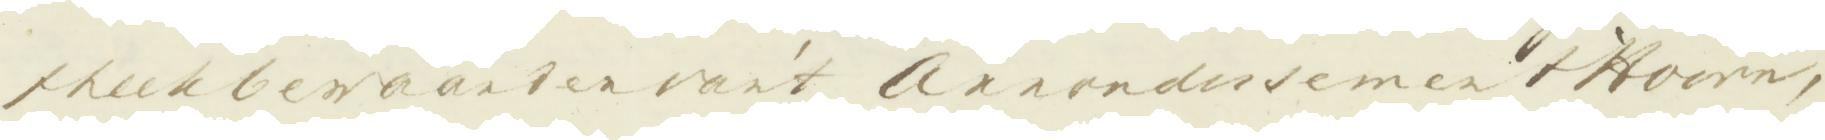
theek bewaarder van ’t Arrondissement Hoorn,
